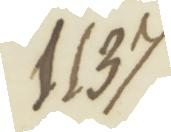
1137
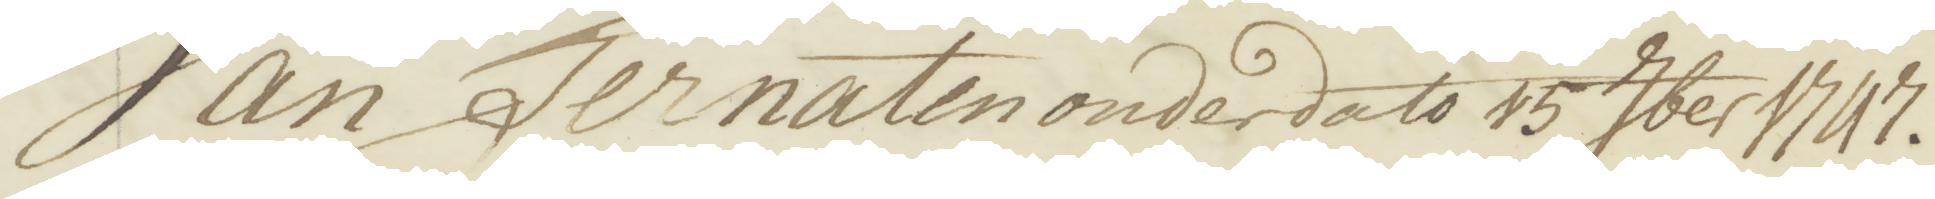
Van Ternaten onderdato 15 7ber 1747.
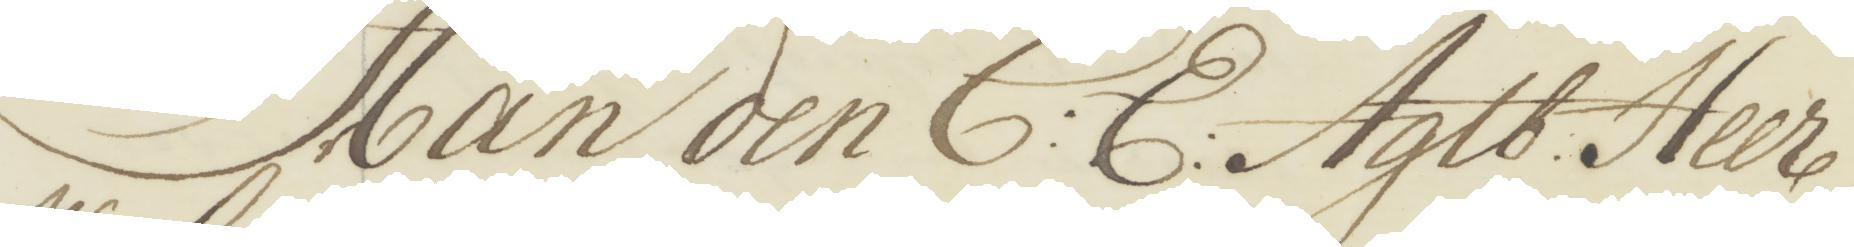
Aan den E:E: Agtb: Heer
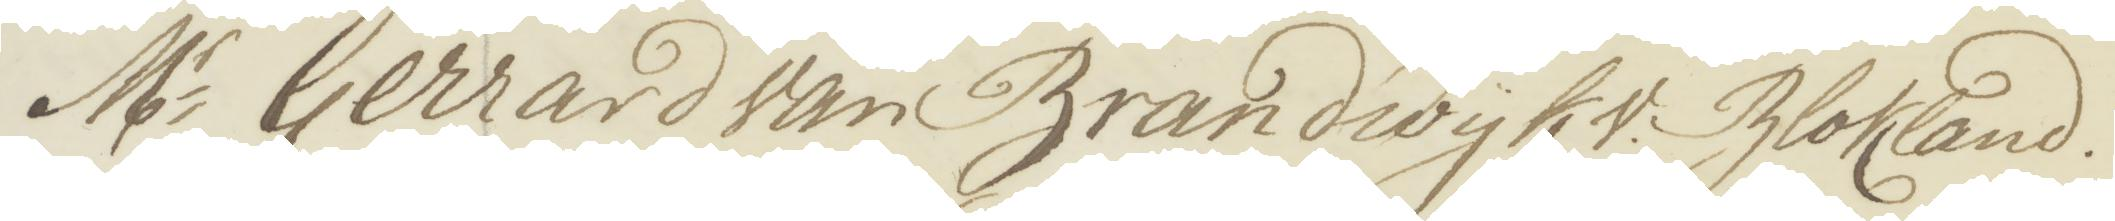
M„r Gerrard van Brandwijk v. Blokland.
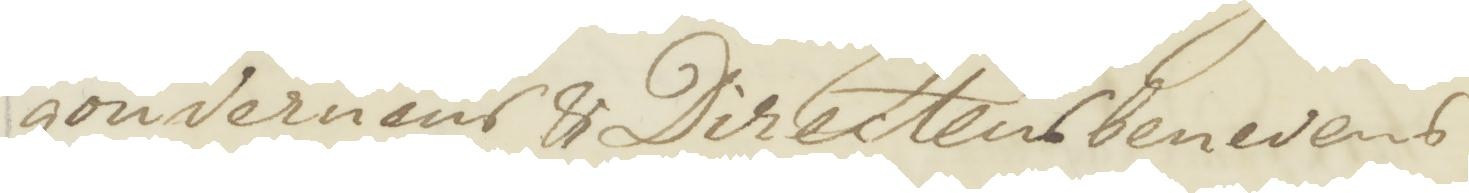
gouverneur & Directeur benevens
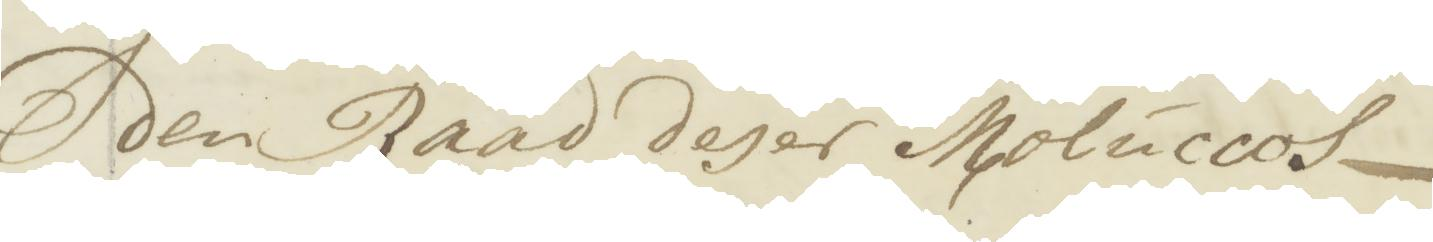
den Raad deser Moluccos—
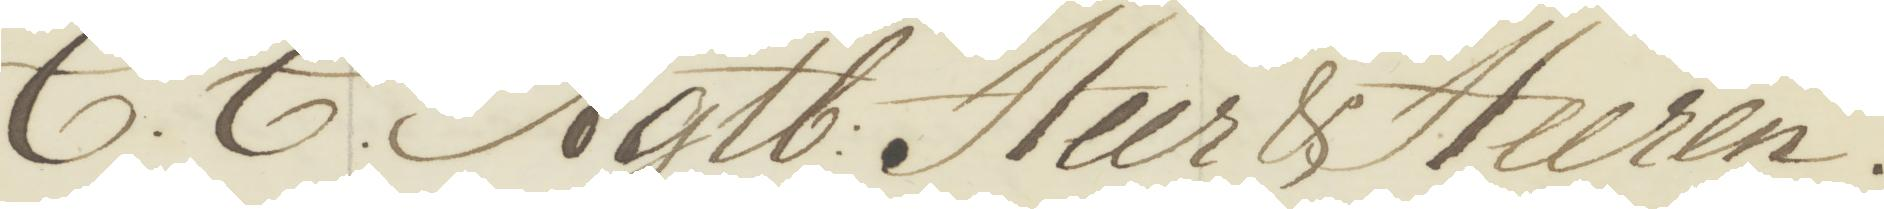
E. E. Agtb: Heer & Heeren
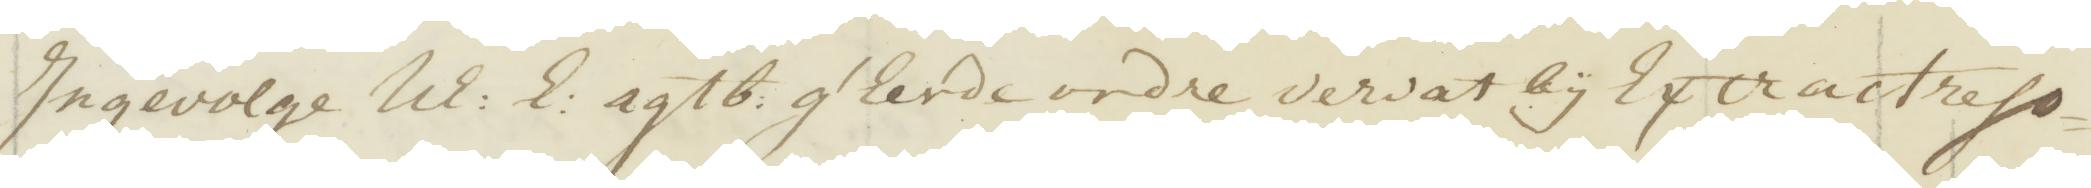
Jngevolge UE: E: agtb: g’Eerde ordre vervat bij Extract reso=
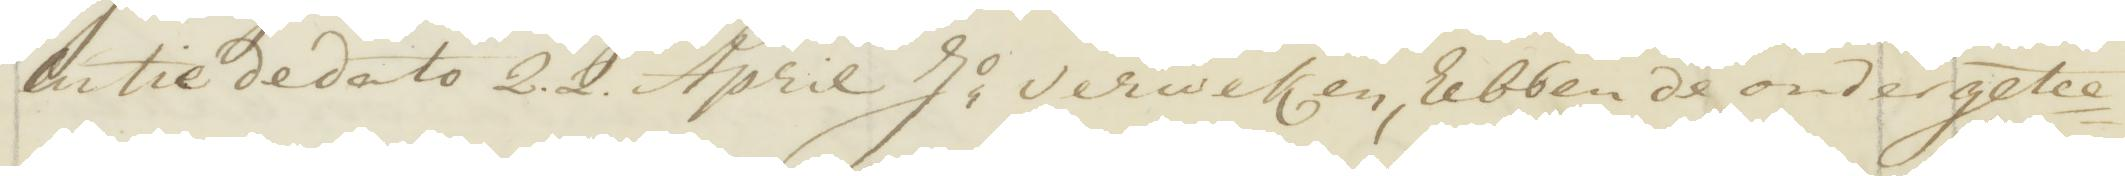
lutie de dato 2.2. April J„o verweken, hebben de ondergetee=
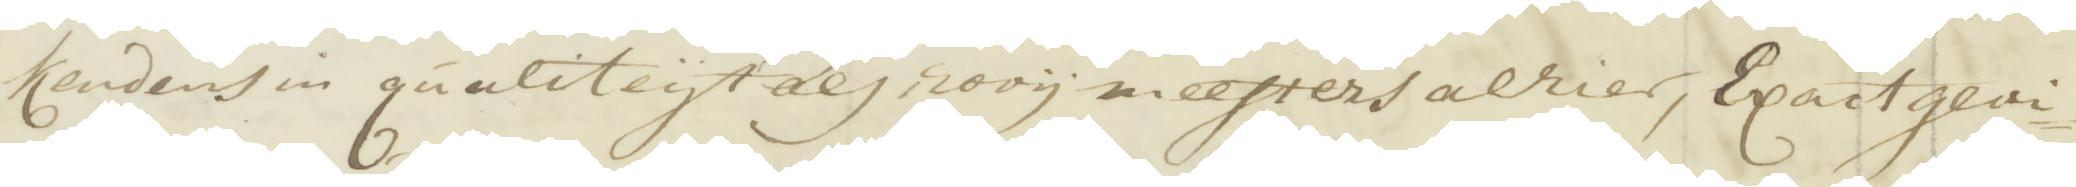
kendens in qualiteijt aen rooij meesters alhier, Exact gevi=
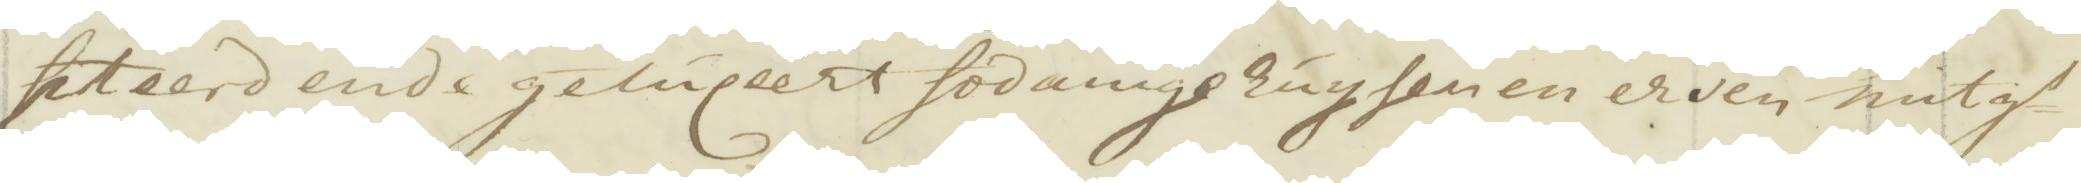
siteerd ende getuxeert sodanige huysen en erven mitg=s
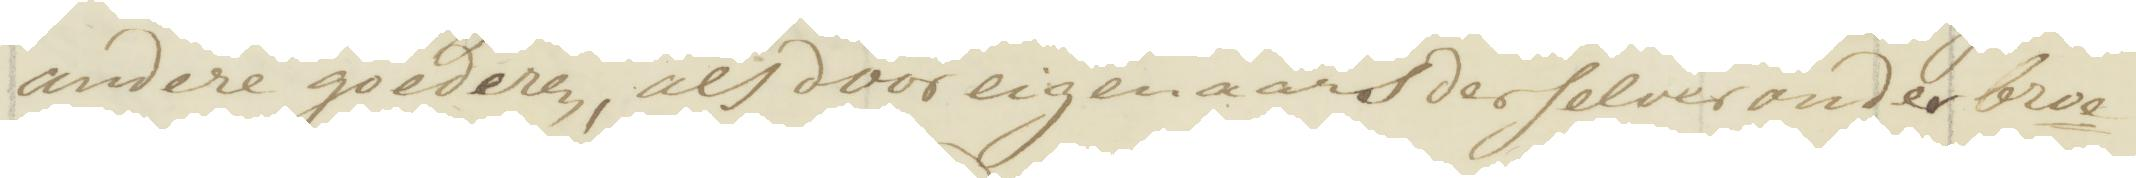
andere goederen, als door eigenaars derselver onder broe=
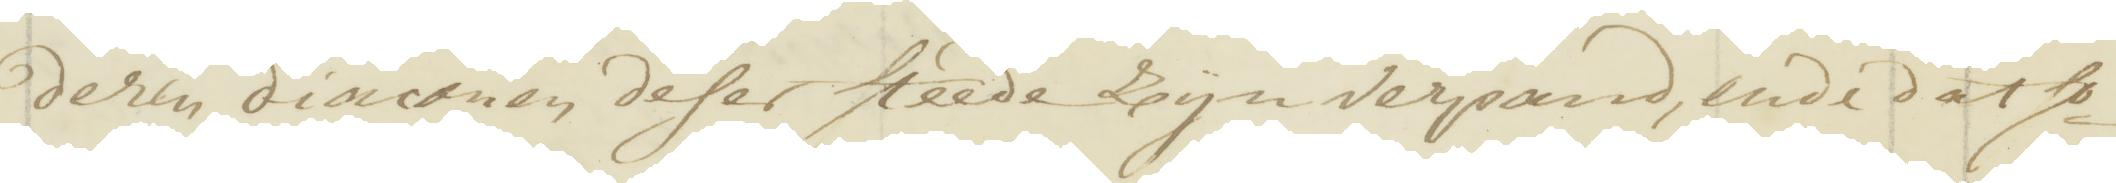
deren diaconen deser steede zijn verpand, ende dat so=
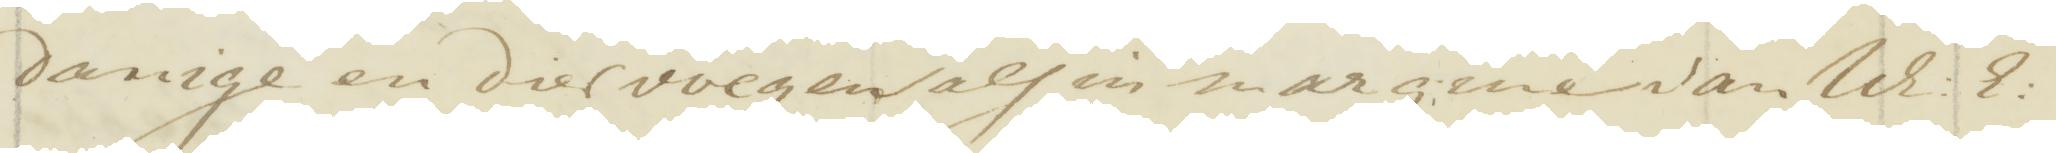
danige en diervolgen als in margine van UE: E:
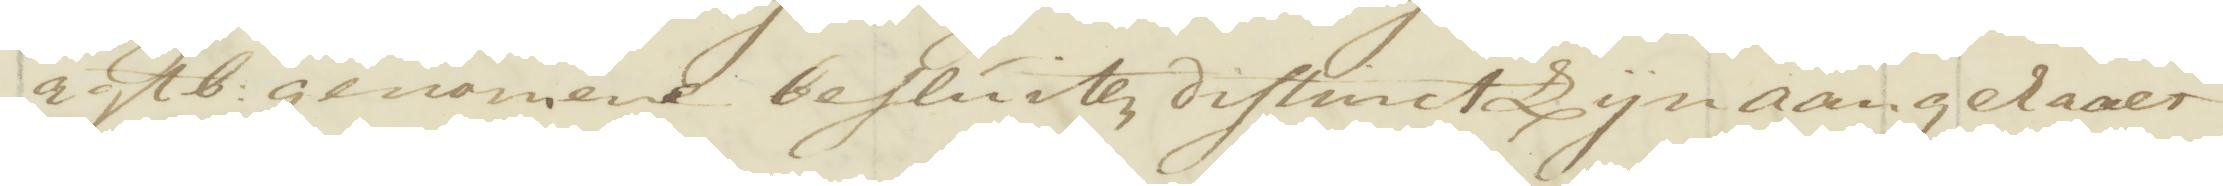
agtb: genomen besluiten distinct zijn aangehaalt
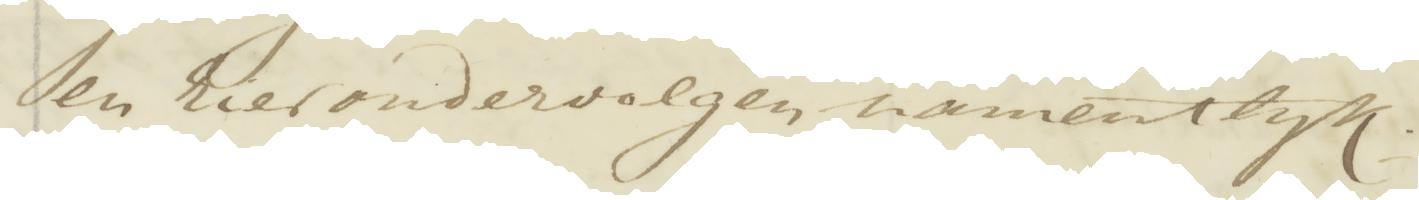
en hierondervolgen nementlyk
